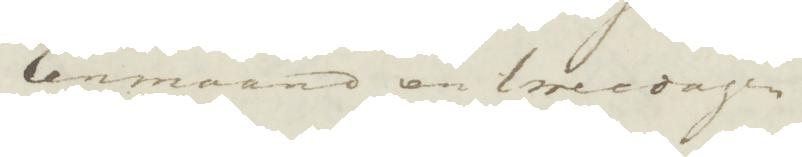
Eenmaand en tweedagen
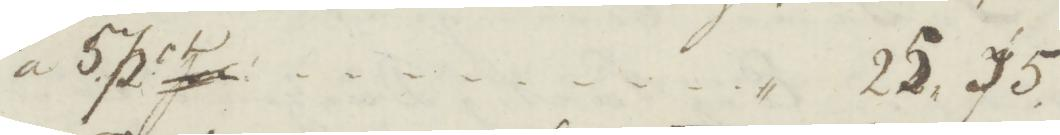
à 5. p.ct. . . . . . . . „ 25„ 15.
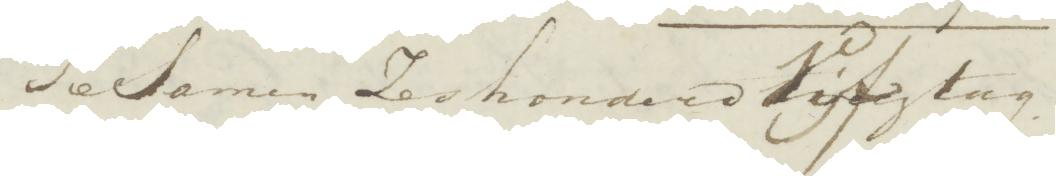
Tesamen Zeshonderd Vijfentag.
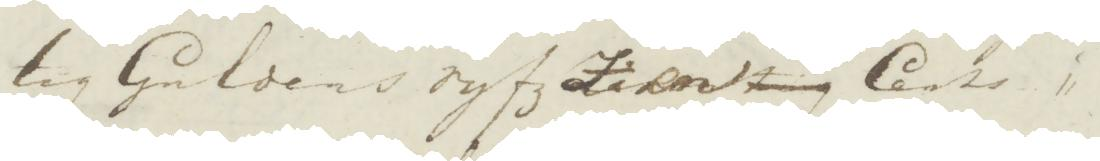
tig Guldens vyfentien Cents „
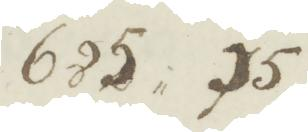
685„ 15
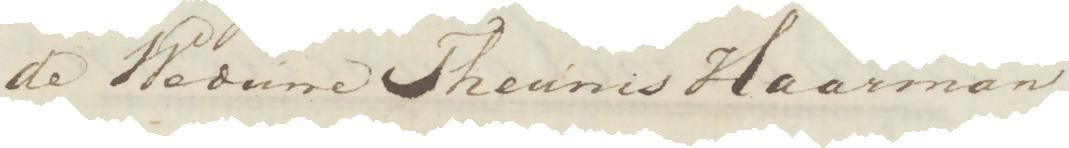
de Weduwe Theunis Haarman,
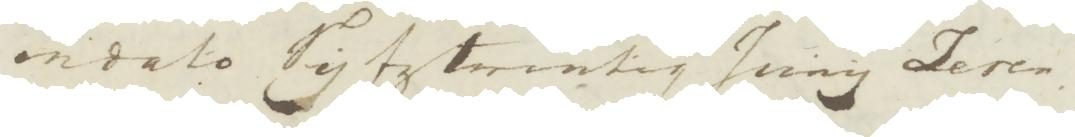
in dato vijfen twintig Junij Zeven
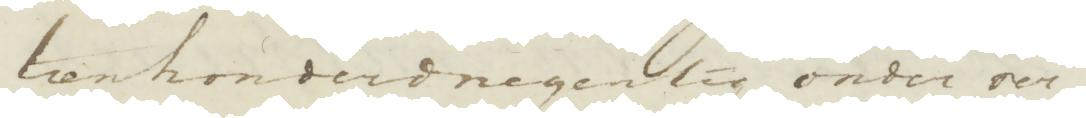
tien honderd negentig onder ver,
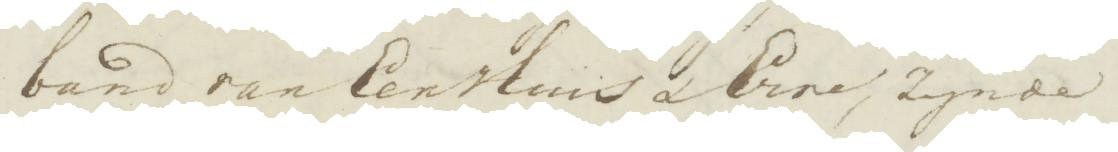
band van een Huis & erve, zynde
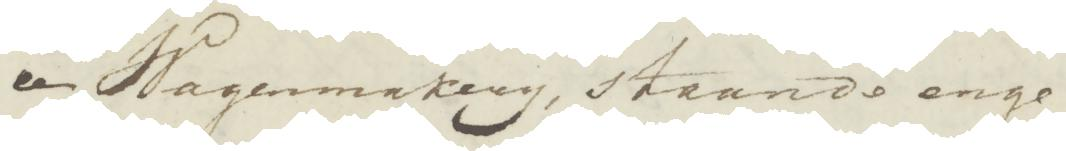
en Wagenmakery, staande en ge
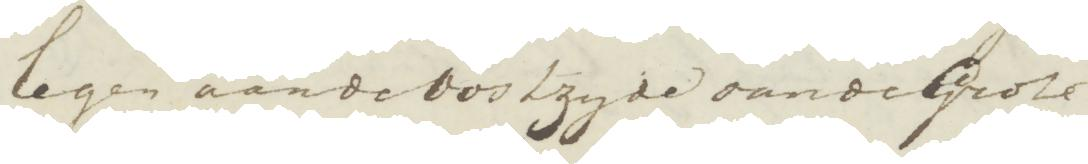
legen aan de Oostzyde van de Grote
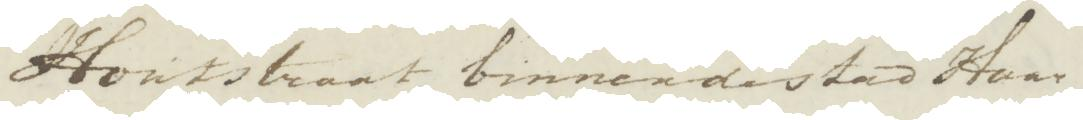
Houtstraat, binnen de stad Haar
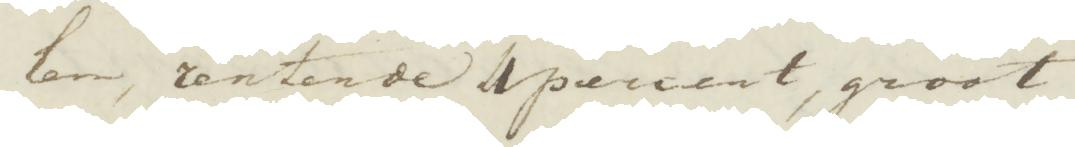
lem, rentende 4 percent, groot
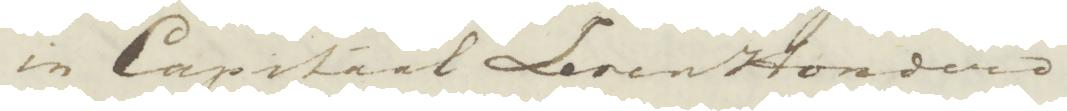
in Capitaal Zeven Honderd
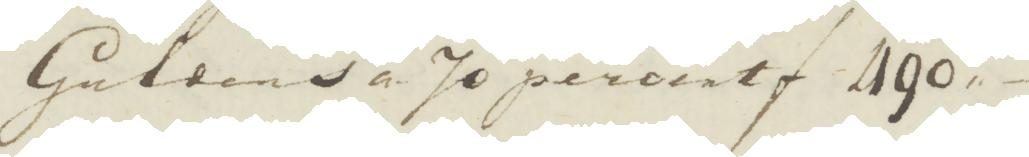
Guldens à 70 percent ƒ 490„-
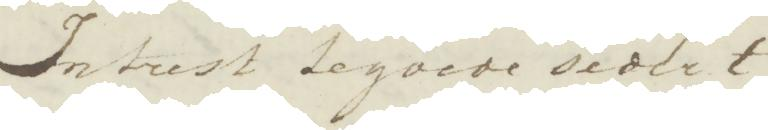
Intrest tegoede sedert
